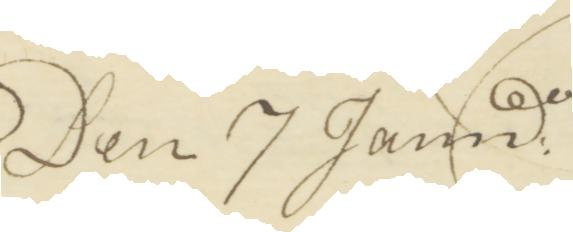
Den 7 Jann:ie
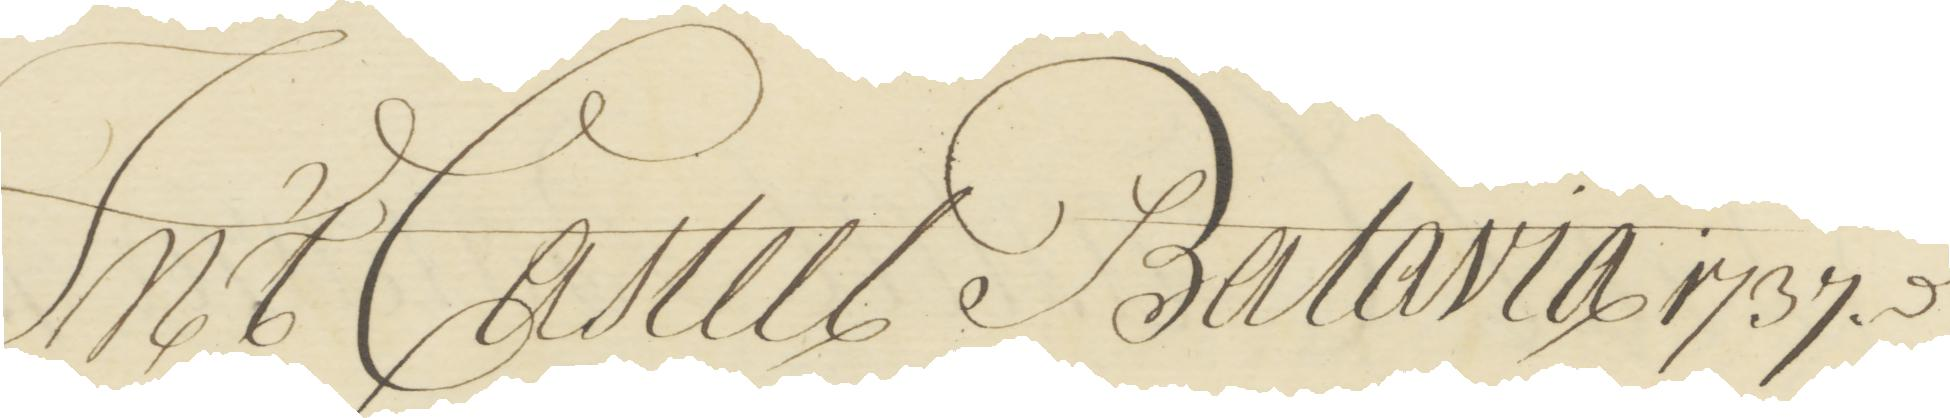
In ’t Casteel Batavia 1737.
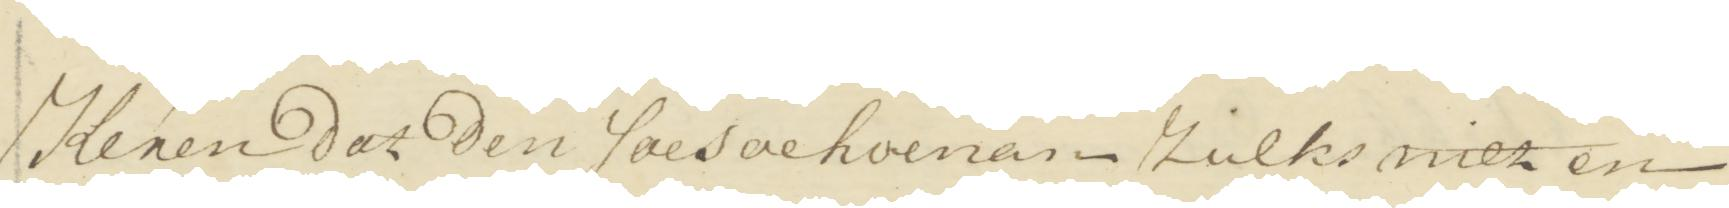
Keren dat den soesoehoenan zulks niet en
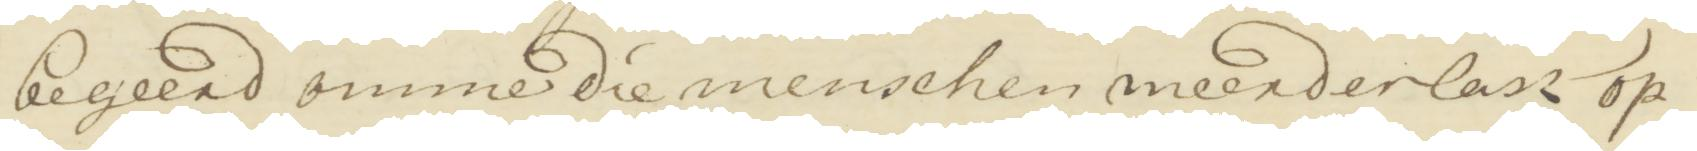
begeerd omme die menschen meerder last op
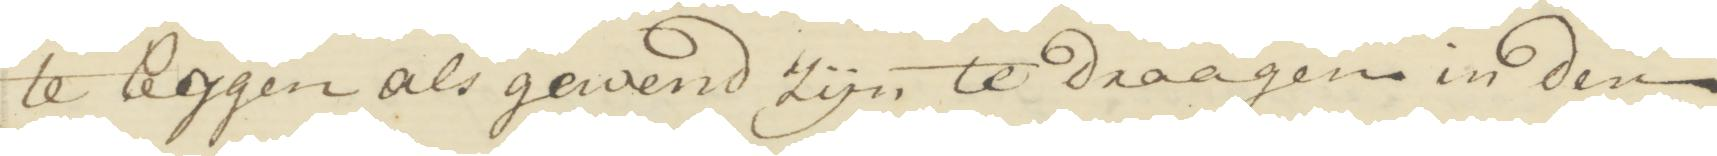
te leggen als gewend zijn te draagen in den
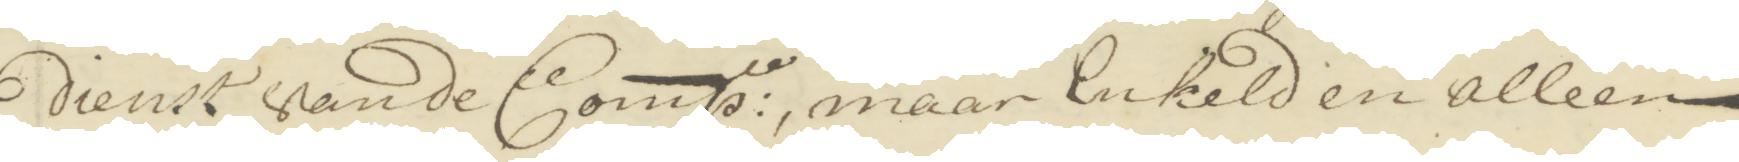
dienst van de Comp:ie, maar Enkeld en alleen
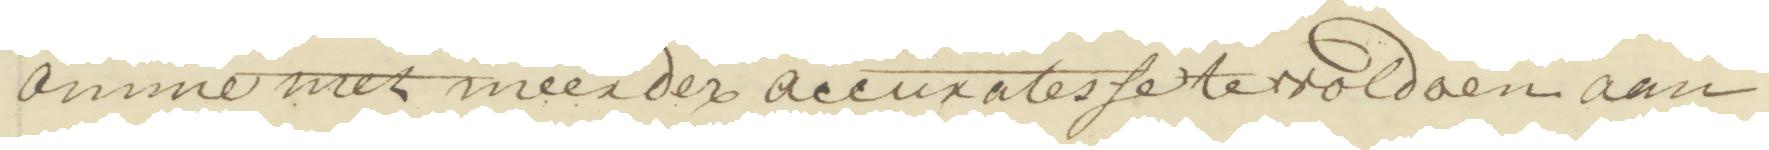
omme met meerder accuratesse te voldoen aan
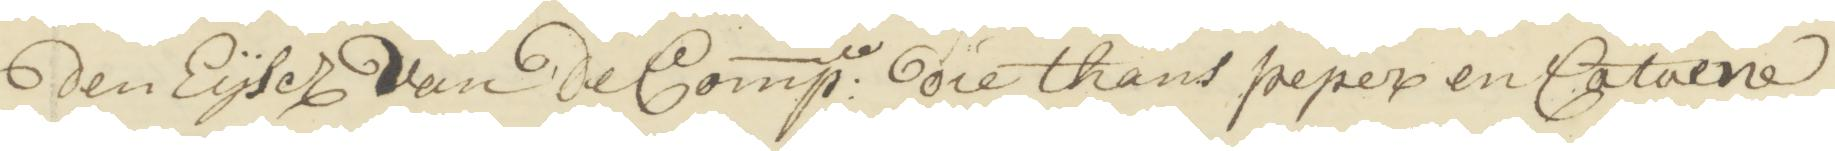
den Eijsch van de Comp:ie die thans peper en catoene
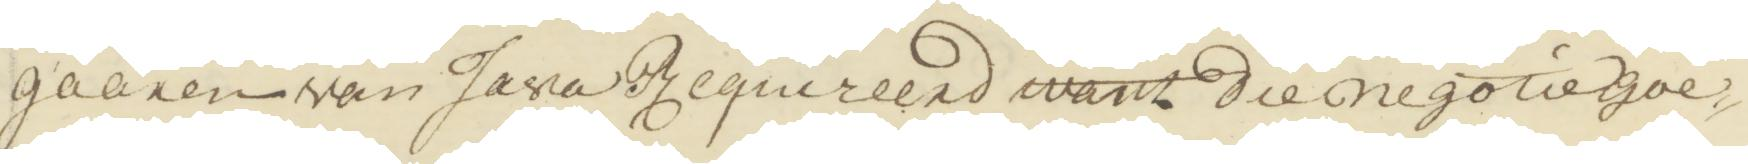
gaaren van Java Requireerd want die negotie goe=
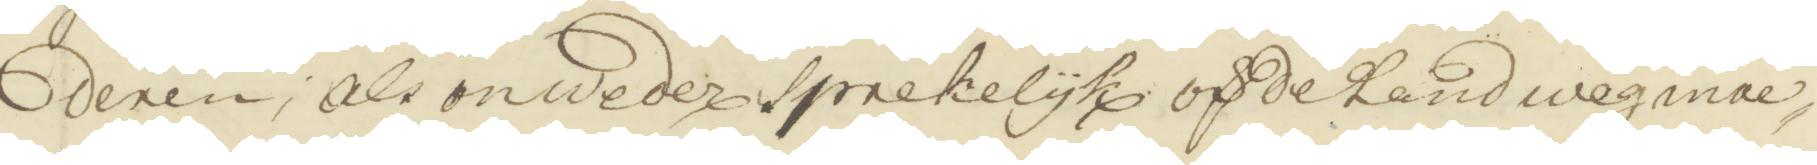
deren, als onweder sprekelijk over de land weg moe=
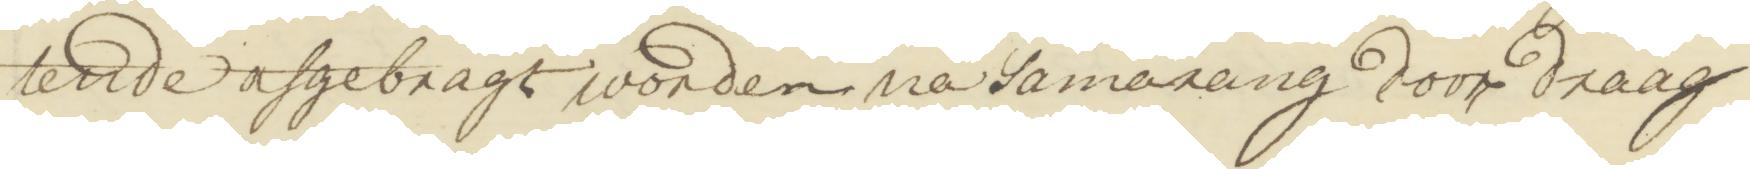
tende afgebragt worden na samarang door draag
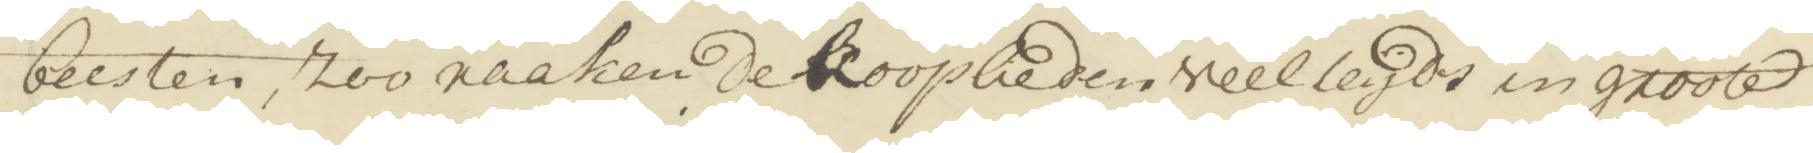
beesten, zoo raaken de kooplieden veelteijds in groote
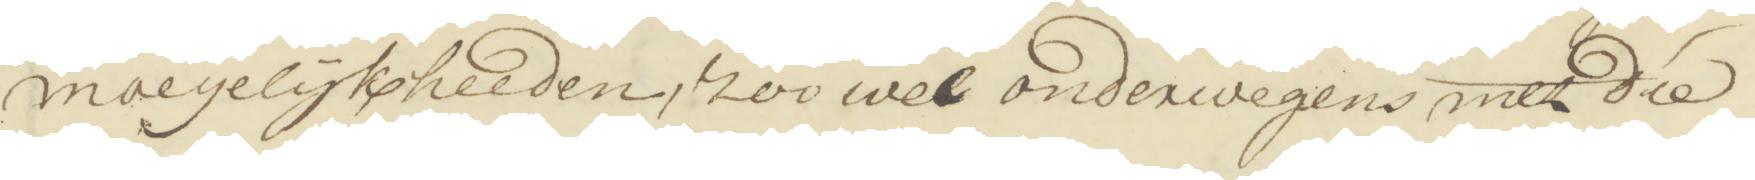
moeyelijkheeden, zoo wel onderwegens met die
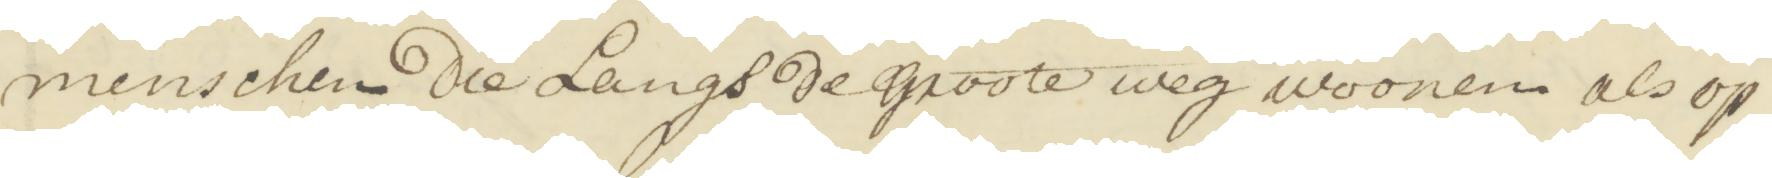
menschen die langs de groote weg woonen als op
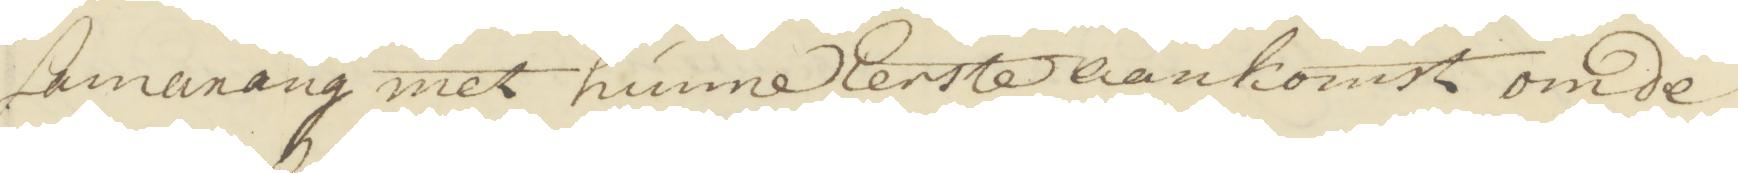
Samarang met hunne Eerste aankomst om de
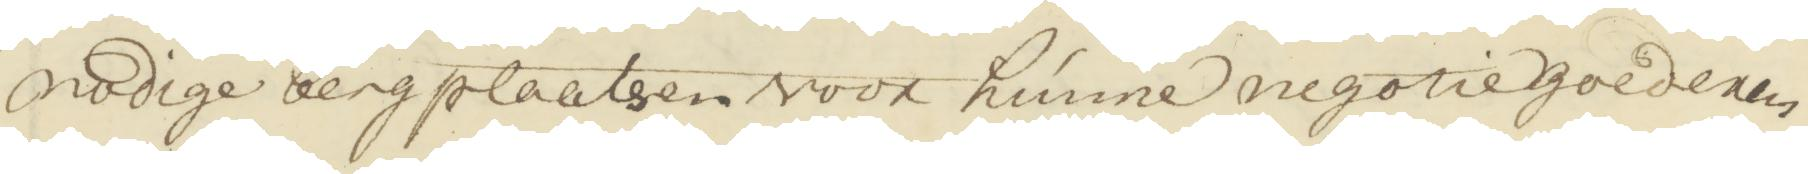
nodige bergplaatsen voor hunne negotie goederen
